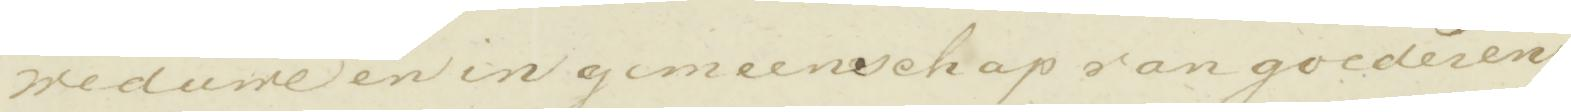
weduwe en in gemeenschap van goederen
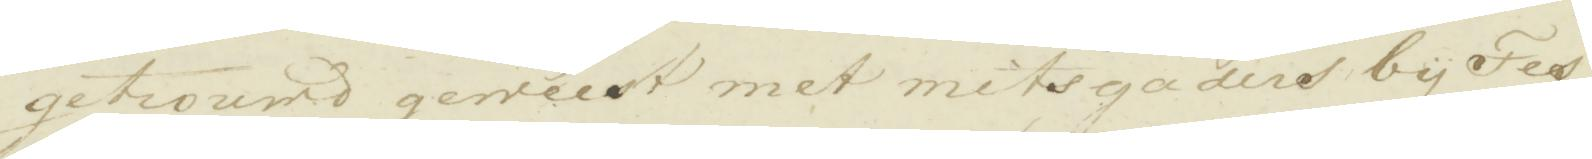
getrouwd geweest met mitsgaders, bij Tes
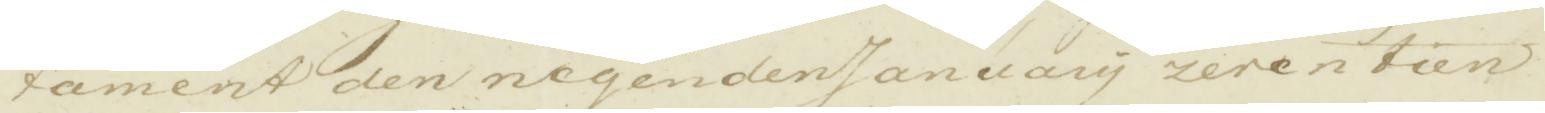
tament den negenden Januarij zeventien
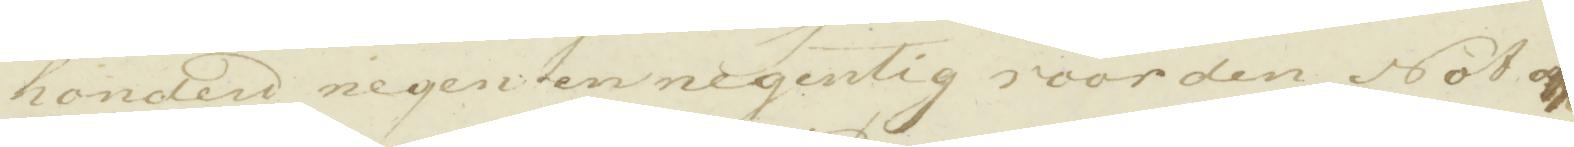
honderd negen en negentig voor den Nota
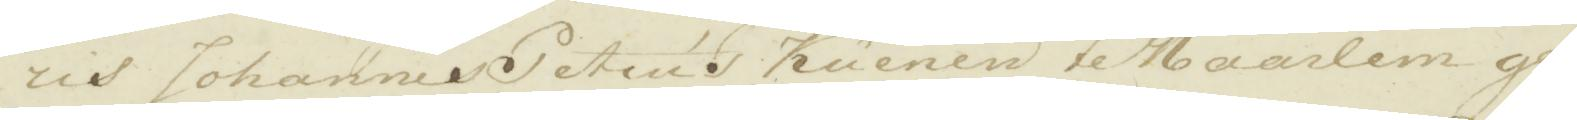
ris Johannes Petrus Kuenen te Haarlem ge
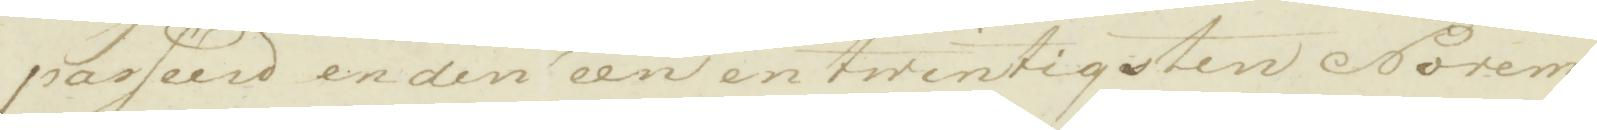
passeerd en den een en twintigsten Novem
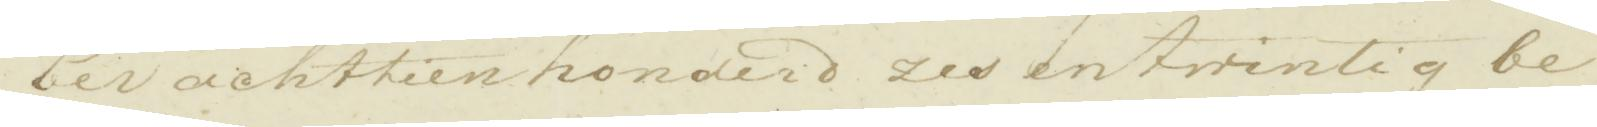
ber achttien honderd zes en twintig be
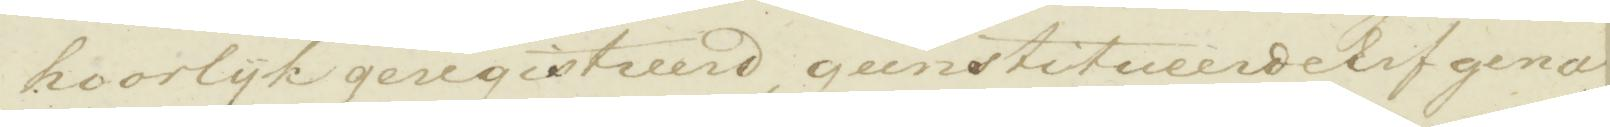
hoorlijk geregistreerd; geïnstitueerde Erfgena
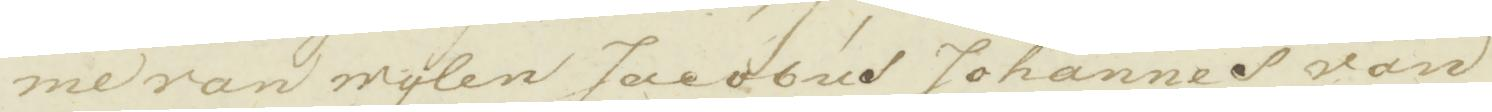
me van wijlen Jacobus Johannes van
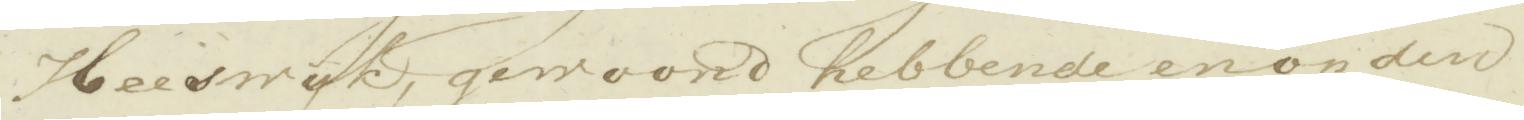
Heeswijk, gewoond hebbende en op den
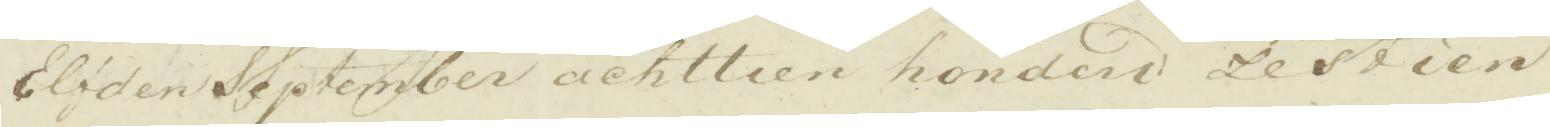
Elfden September achttien honderd zestien
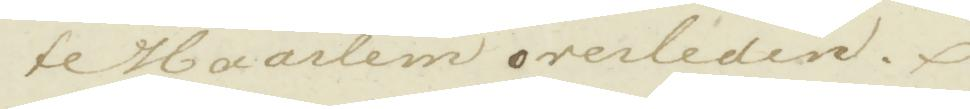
te Haarlem overleden.
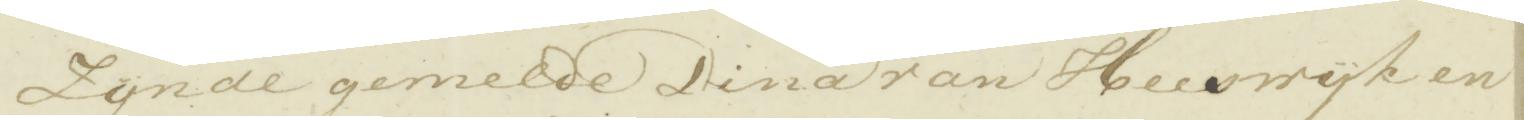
Zijnde gemelde Dina van Heeswijk en
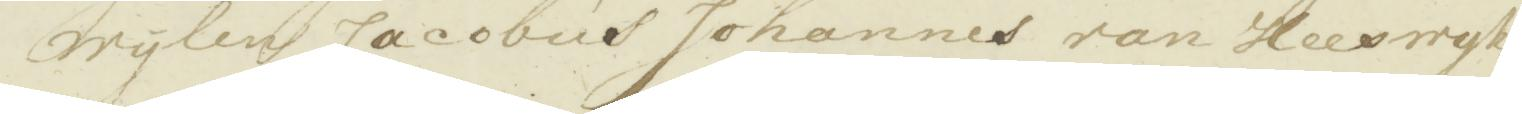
wijlen Jacobus Johannes van Heeswyk
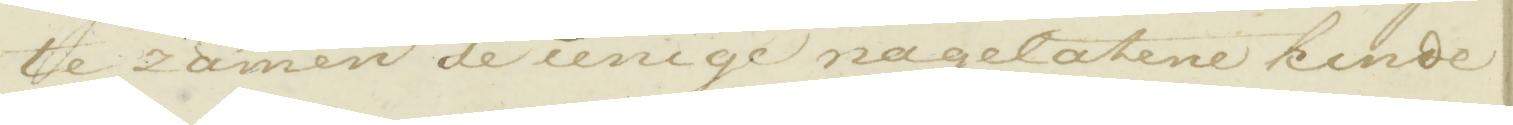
te zamen de eenige nagelatene kinde
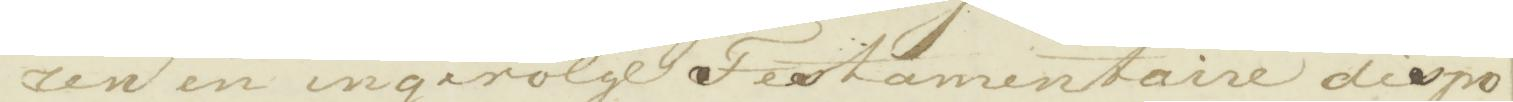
ren en ingevolge Testamentaire dispo
